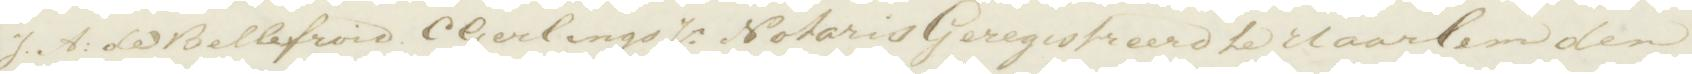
J. A: de Bellefroid C Gerlings J.r Notaris Geregistreerd te Haarlem den
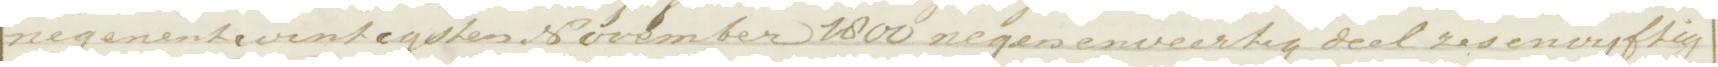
negenenzeventigsten November 1800 negen enveertig deel zesenvyftig
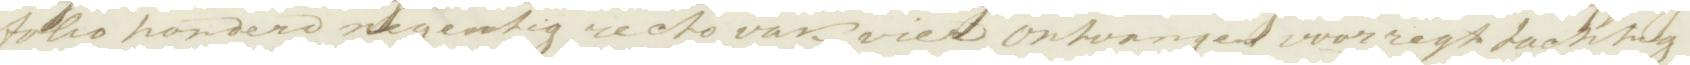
folio honderd negentig recto van vier ontvangen voor regt tachtig
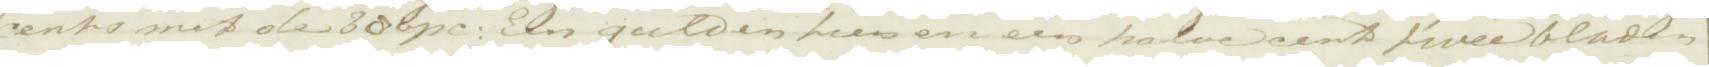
cents met de 38 opc: Een gulden tien en een halve cent twee bladen
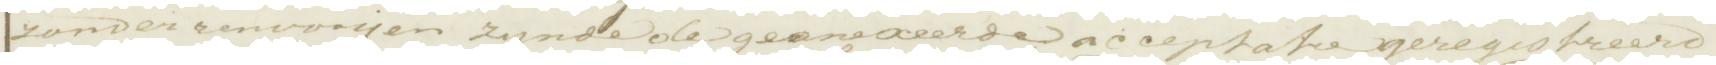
zonder renvooijen zynde de geanexeerde acceptatie geregistreerd
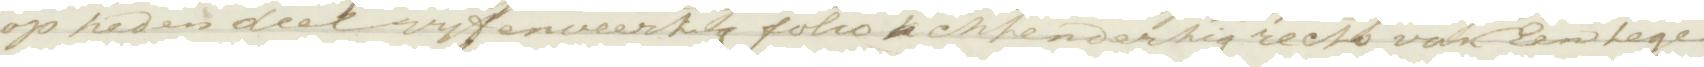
op heden deel vyfenveertig folio achtendertig recto van Een leges
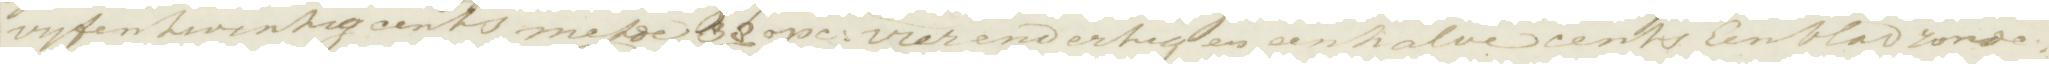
vyfen twintig cents met de 38 opc: vier endertig en een halve cents Een blad zonde
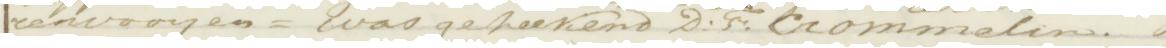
renvooyen = was geteekend D: F: Crommelin.
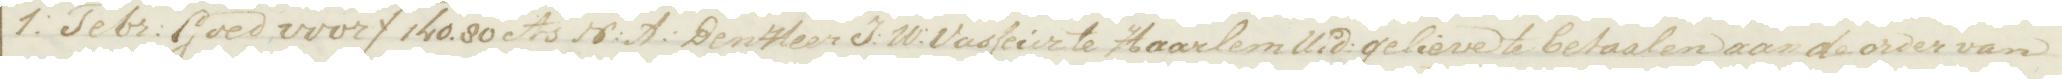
1: Febr: Goed, voor ƒ 140. 80 As N: A: Den Heer I: W: Vasseur te Haarlem U. d: gelieve te betaalen aan de order van
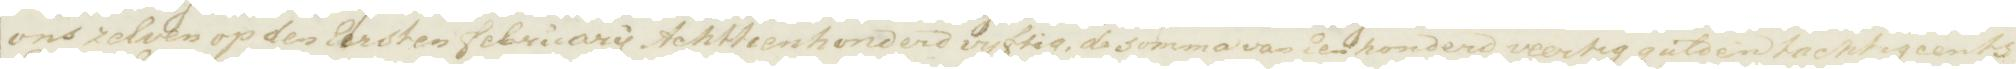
ons zelven op den Eersten februarij Achttienhonderd vyftig, de somma van Een honderd veertig gulden tachtig cents
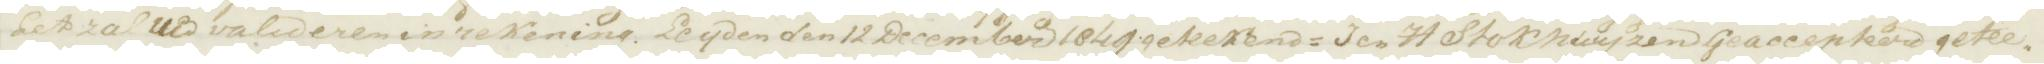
het zal UEd valideren in rekening, Leyden den 12 December 1849 geteekend = Ian H Stokhuyzen Geaccepteerd getee„
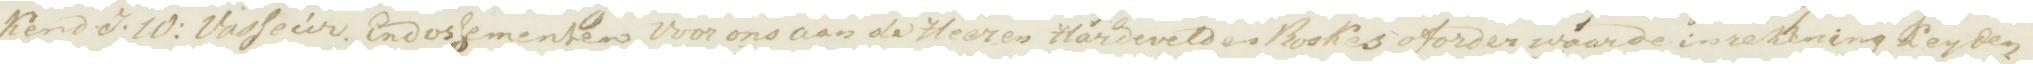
Kend. I. W: Vasseur. Endossementen voor ons aan de Heeren Hardeveld en Boskes oforder waarde in rekening Leyden
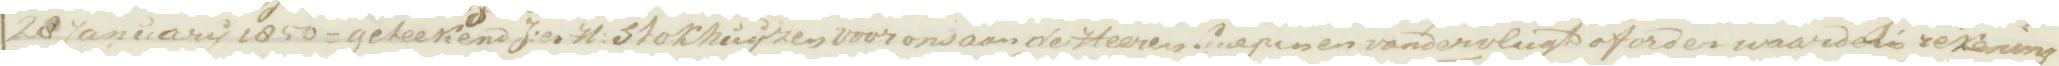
28 Januarij 1850 = geteekend J: en H: Stokhuijzen voor ons aan de Heeren Guepin en van der vlugt of order waarden rekening
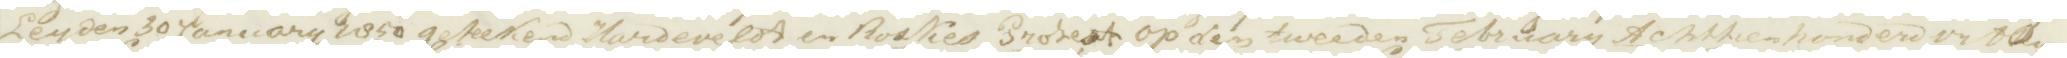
Leyden 30 January 1850 geteekend Hardeveldt en Roskes Protest op den tweeden February Achttien honderd vyftien
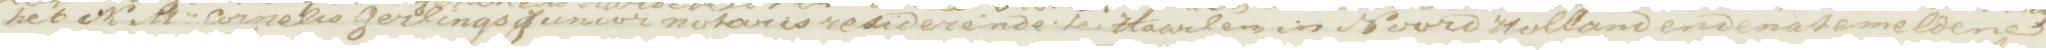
heb ik M: Cornelis Gerlings Junior notaris residerende te Haarlem in Noord Holland ende natemeldene
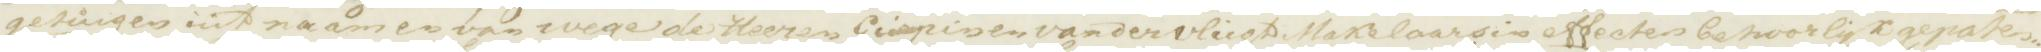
getuigen uit naam en van wege de Heeren Guepin en van der Vlugt Haselaars in effectes behoorlijk gepaten„
